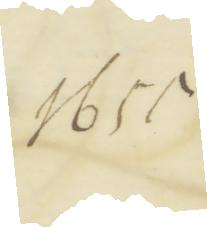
1655
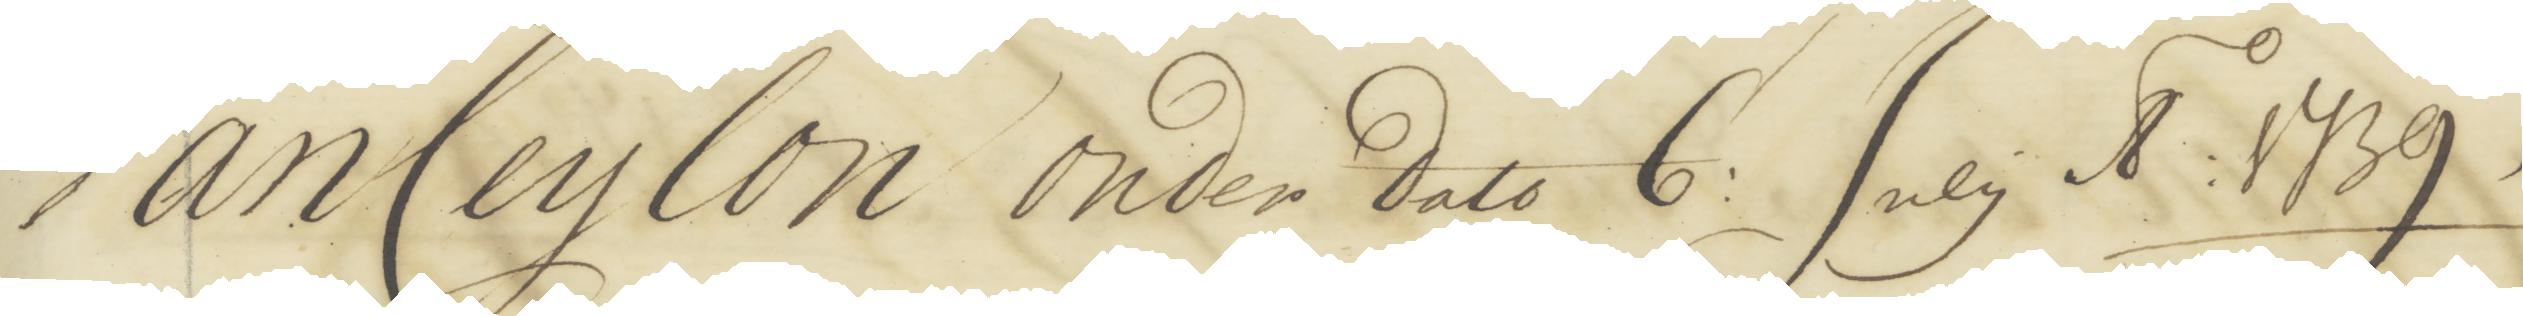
Van Ceylon onder dato 6:' Julij A:o 1739.
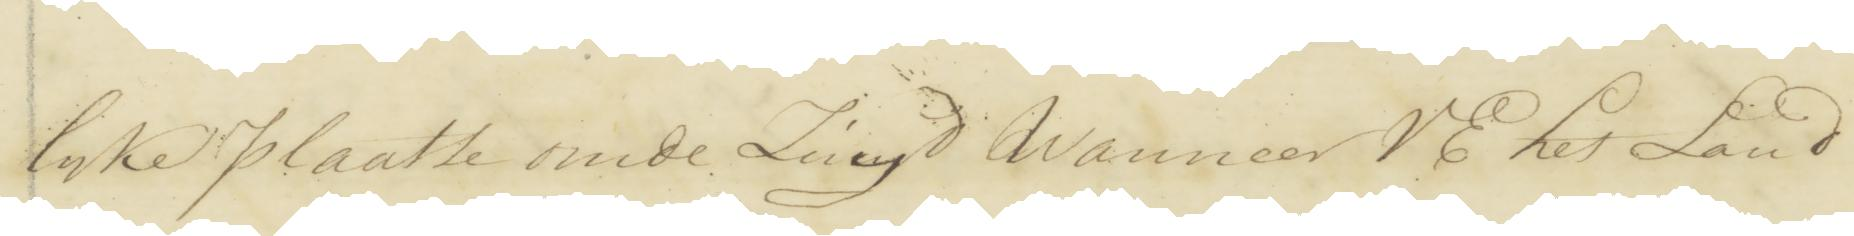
lyke plaatse om de Zuyd wanneer VE het Land
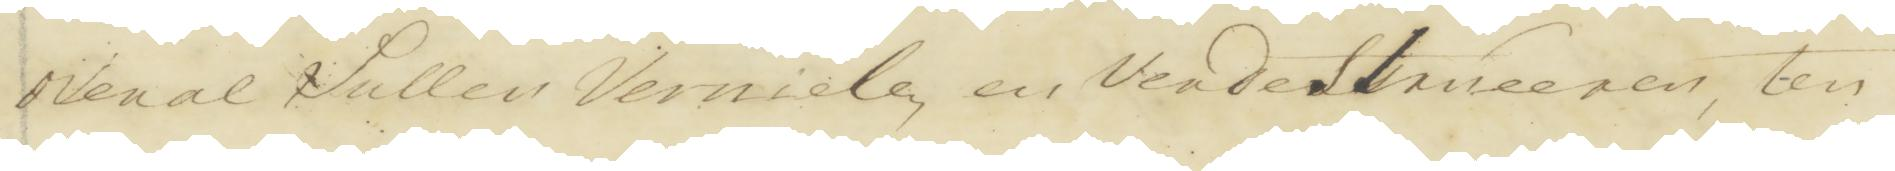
overal sullen vernielen en verdestrueeren, ten
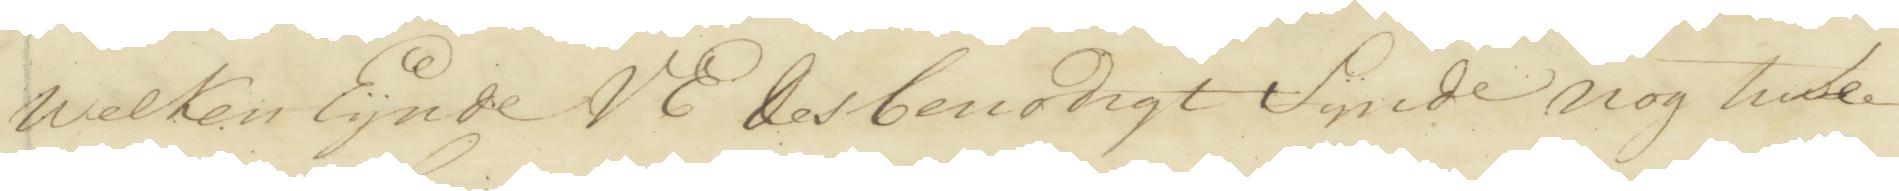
welken Eijnde VE des benodigt sijnde nog twee
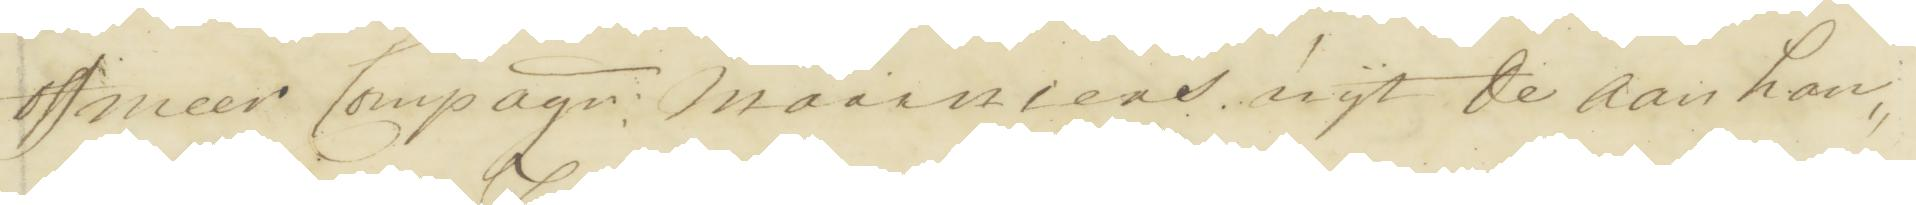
offmeer Compagn: mariniers uijt de aan hou„
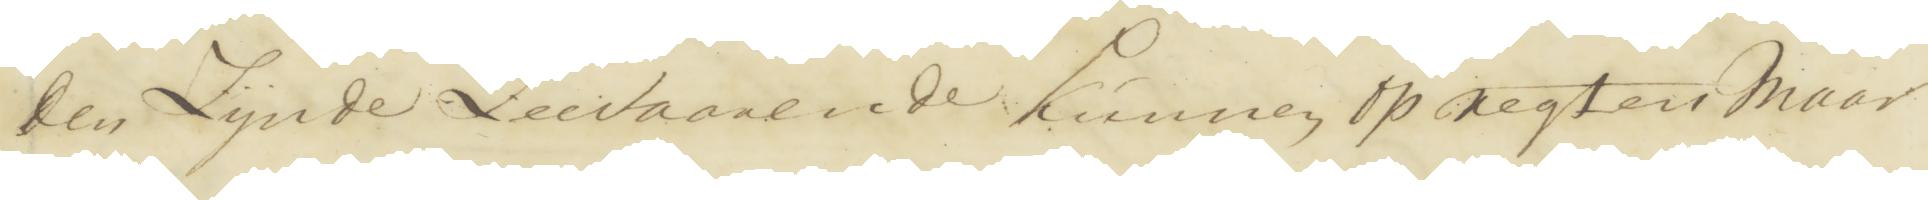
den zijnde zeevaarende kunnen op regten maar
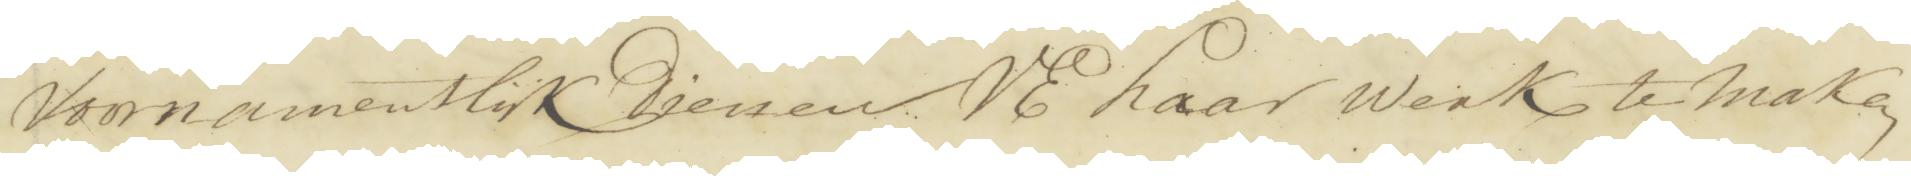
voornamentlijk dienen VE haar werk te maken
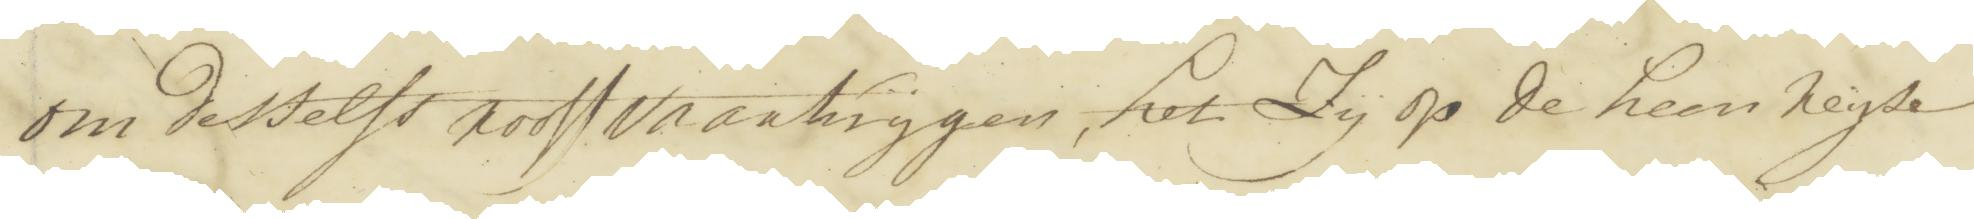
om desselfs rooffvaartuijgen, het zij op de heen reijse
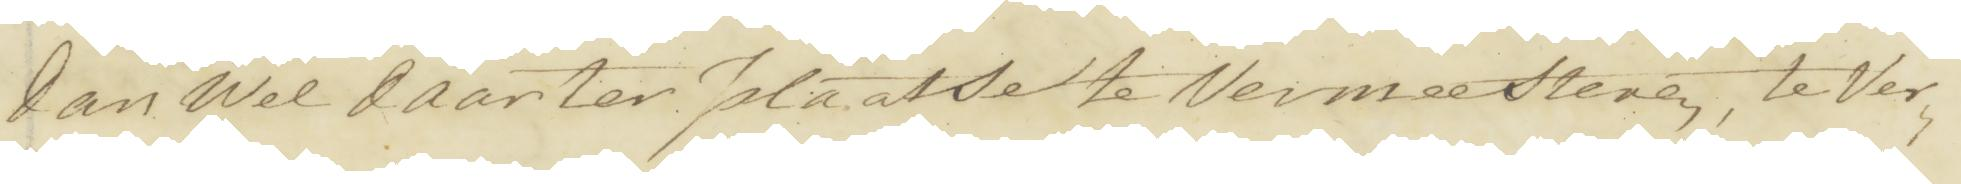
dan wel daar ter plaatse te vermeesteren, te ver„
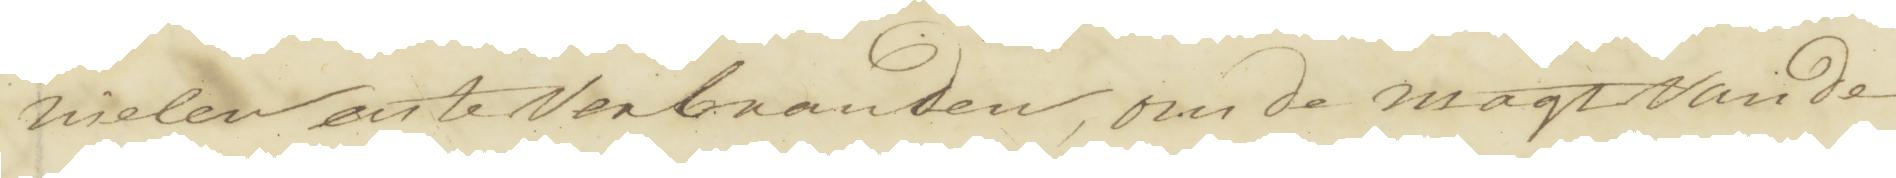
nielen en te verbranden, om de magt van de
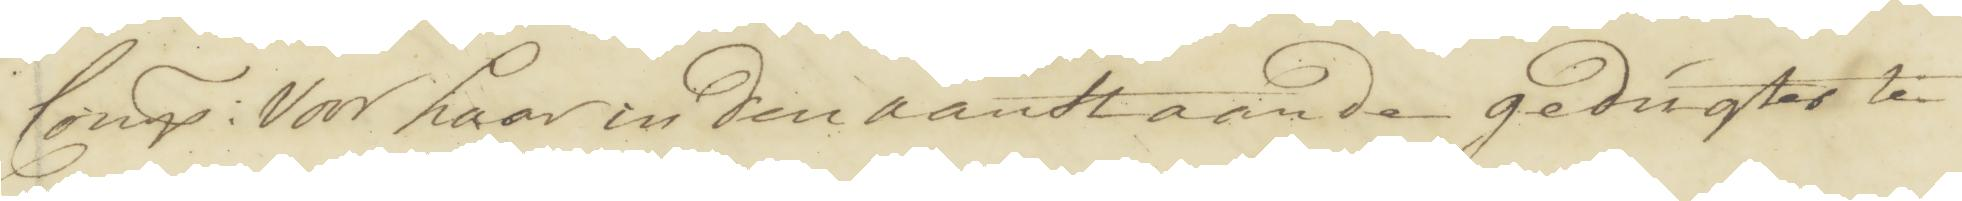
Comp: voor haar in den aanstaande gedugter te
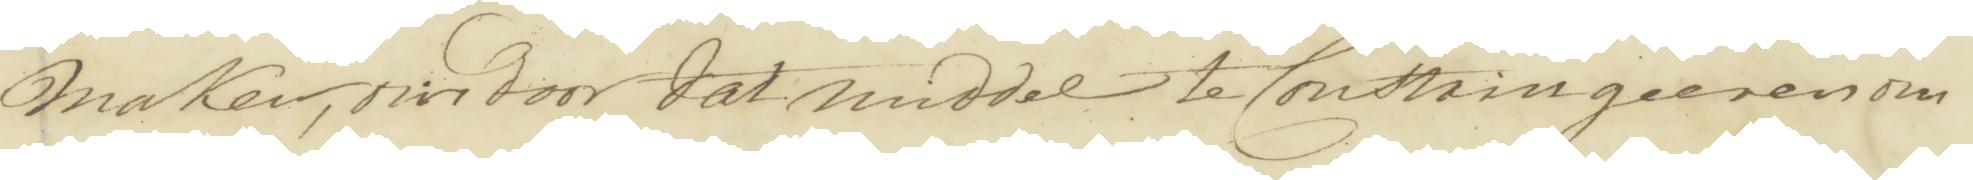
maken, om door dat middel te Constringeeren om
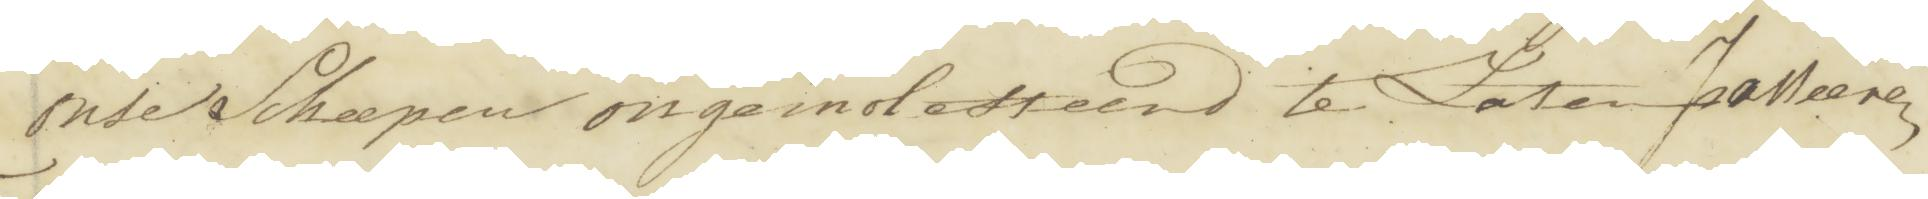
onse scheepen ongemolesteerd te Laten passeren
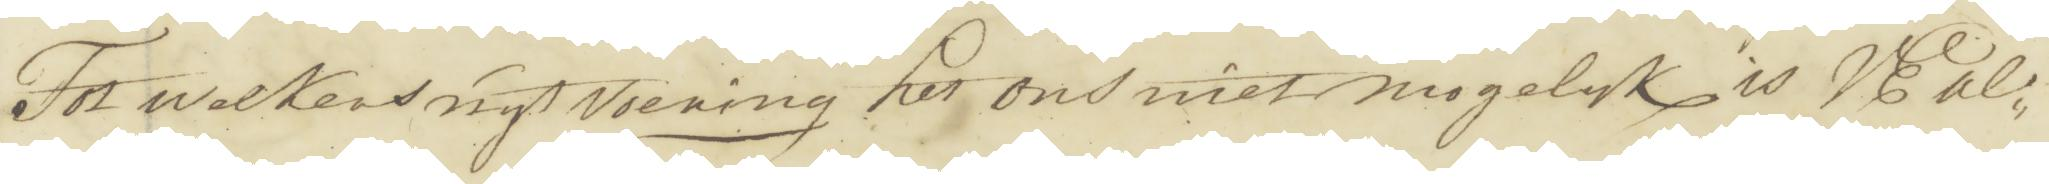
Tot welkers uijt voering het ons niet mogelyk is VE al„
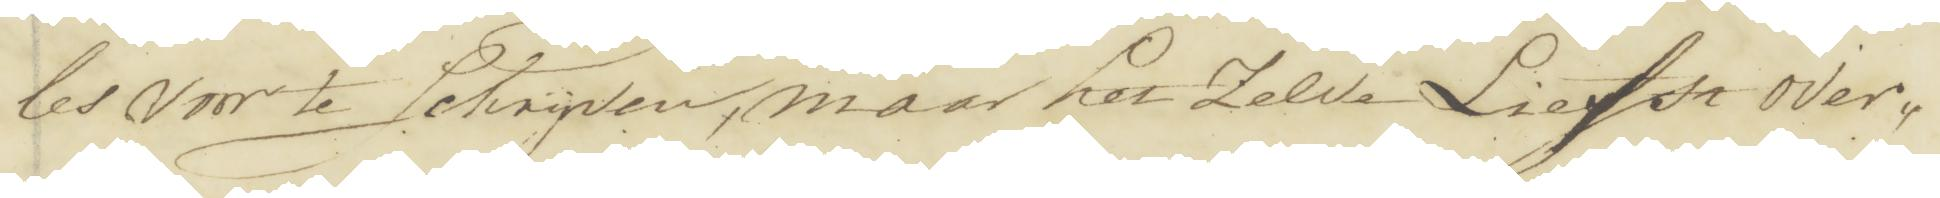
les voor te schrijven, maar het zelve Liefst over„
